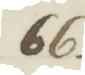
66.
